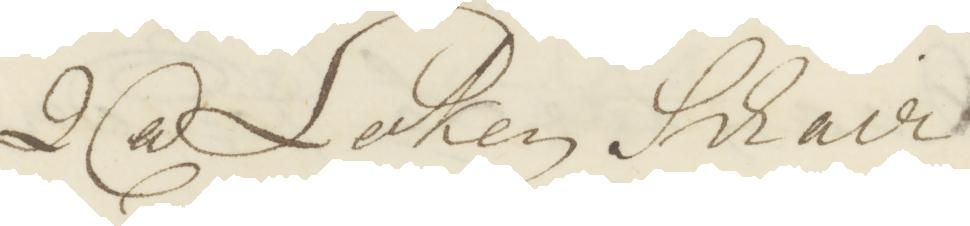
2 @ Laken schair
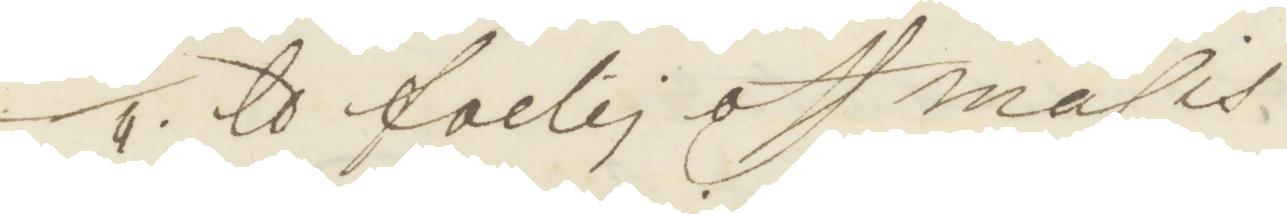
¼. ld foelij off macis
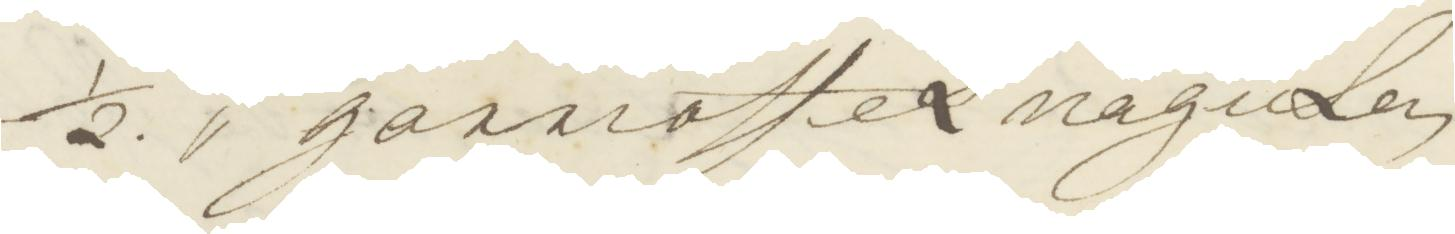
½. „ garrioffel nagulen
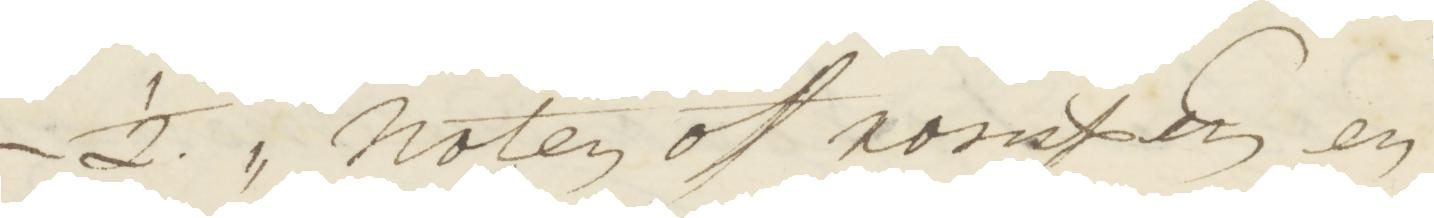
½. „ noten off rompen en
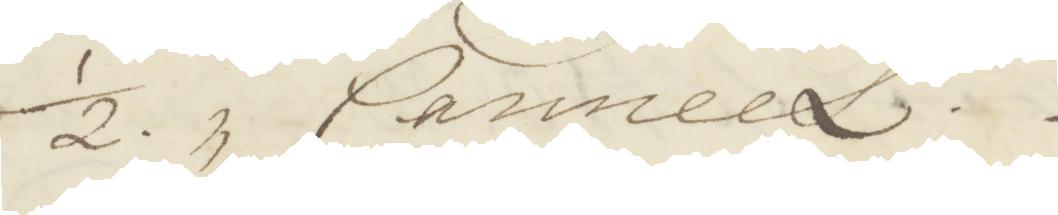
½. „ Canneel.
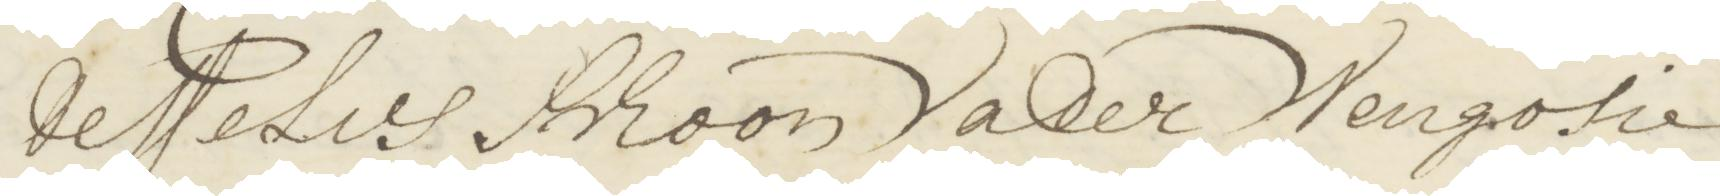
desselvs schoon Vader Wengosie
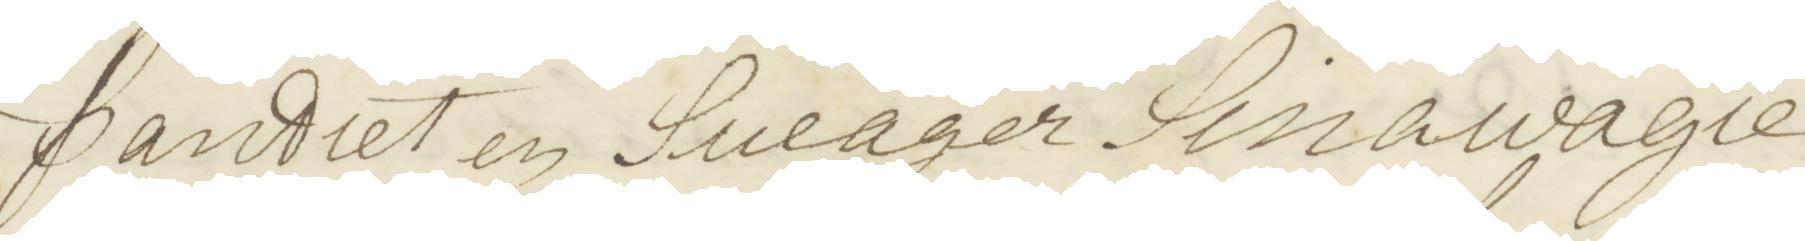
Pandiet en Sulager Sinawagie
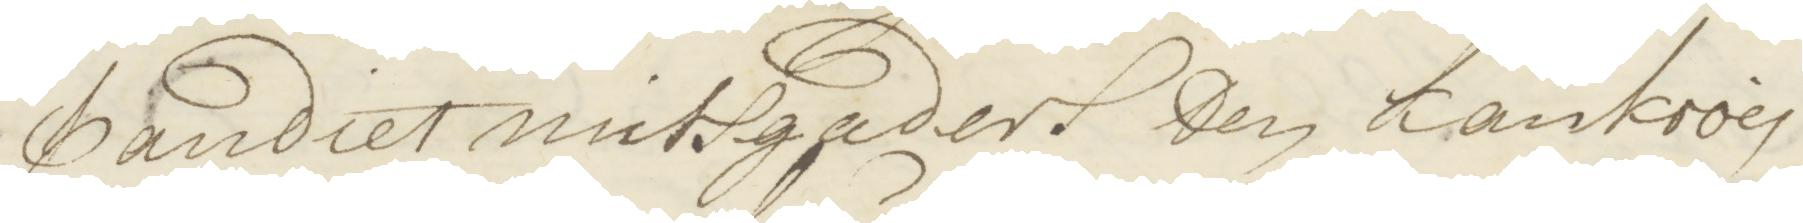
pandiet mitsgaaders den kankroij
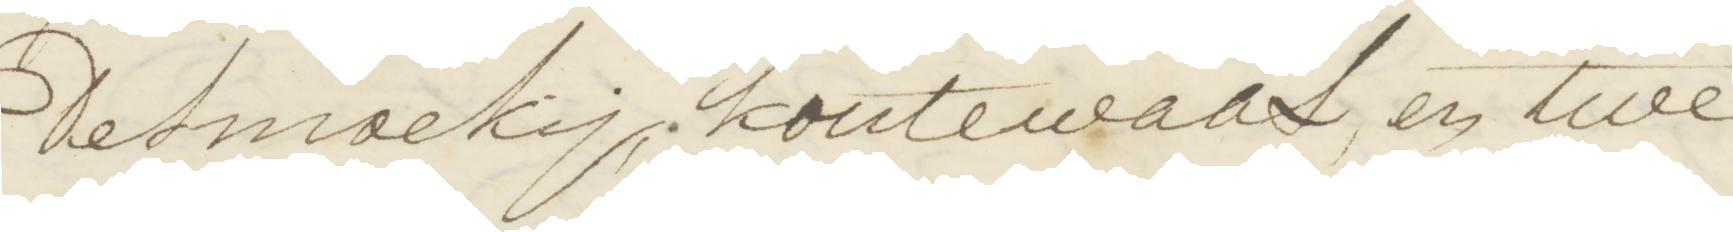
desmoekij, koutewaal, en twee
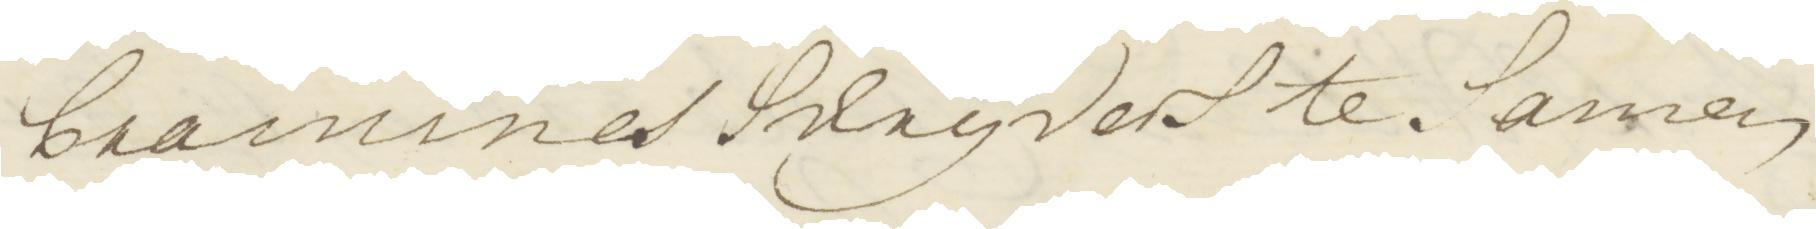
bramines schrijvers te samen
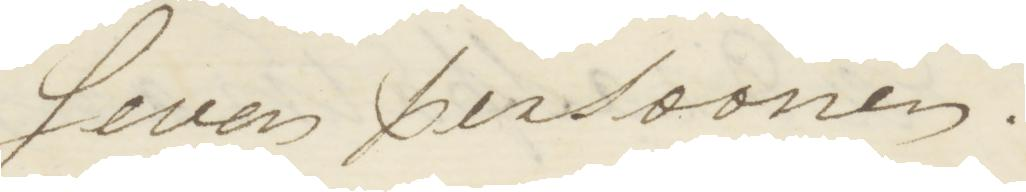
seven persoonen.
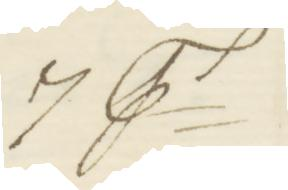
7 p=s
